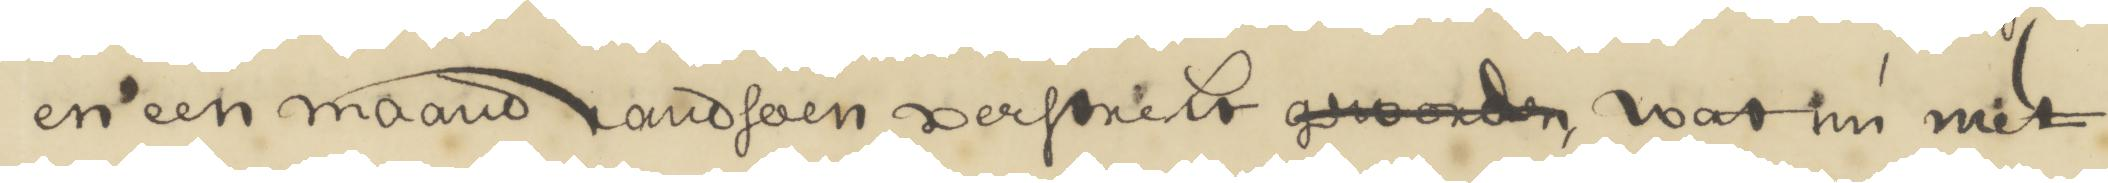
en een maand randsoen verstrekt geworden, wat nu met
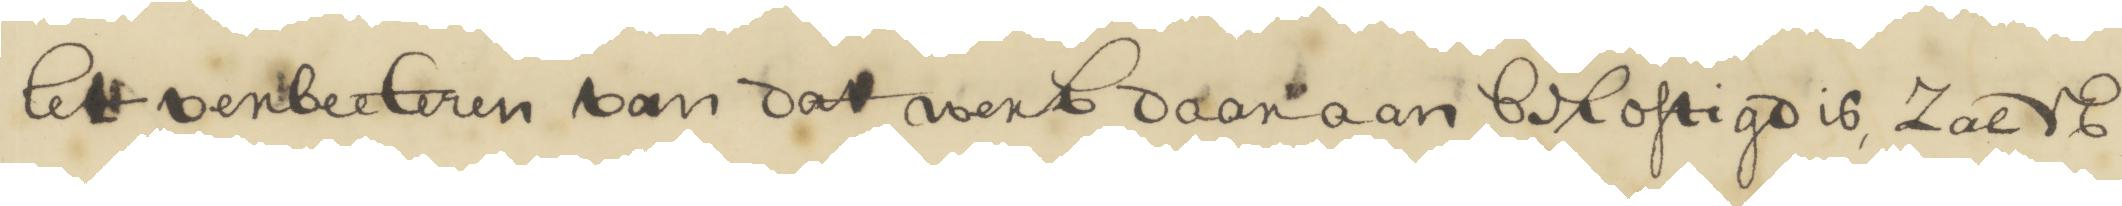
het verbeeteren van dat werk daar aan bekostigd is, zal VE
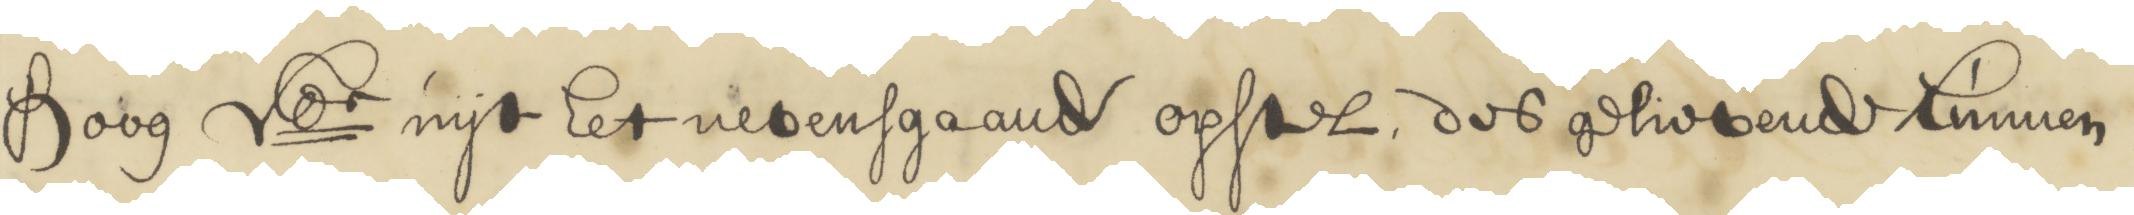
Hoog Ed=s uijt het nevensgaande opstel, des gelievende kunnen
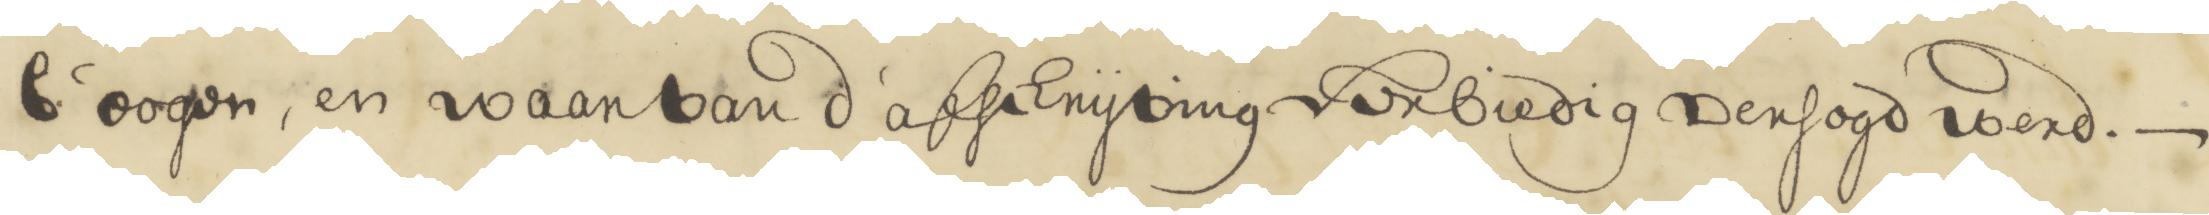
b'oogen, en waarvan d’afschrijving Eerbiedig versogd werd. —
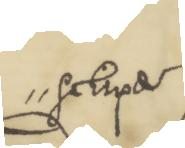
„schip de
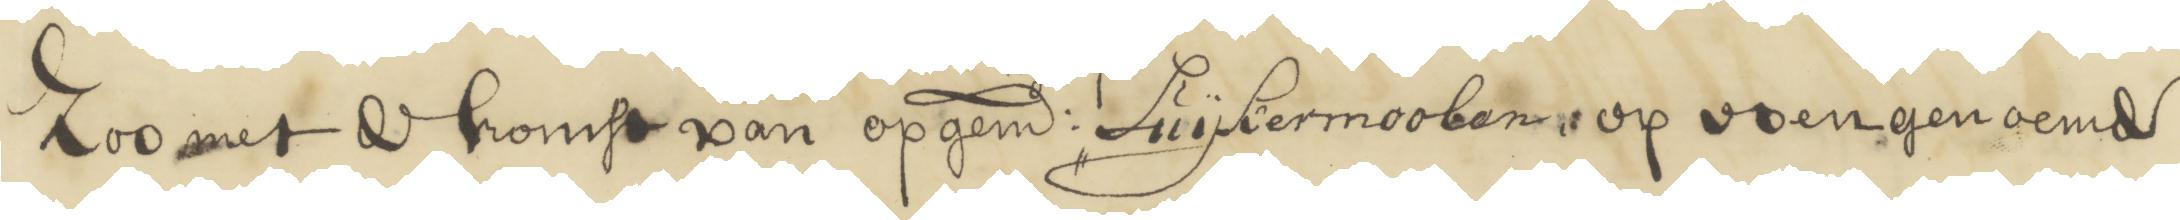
Zoo met de komst van op gem: suijkermoolen, op even'genoemde
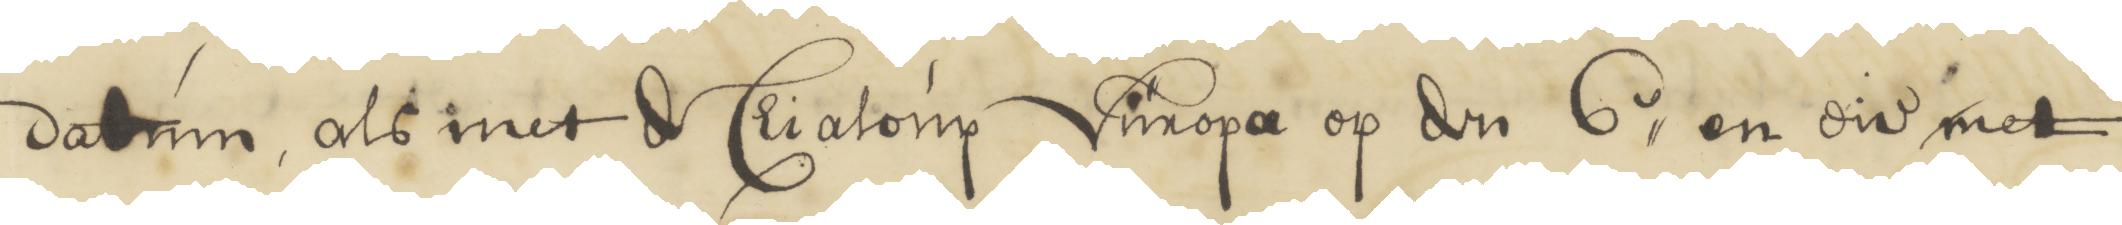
datum, als met de Chialoup Europa op den 6„e en die met
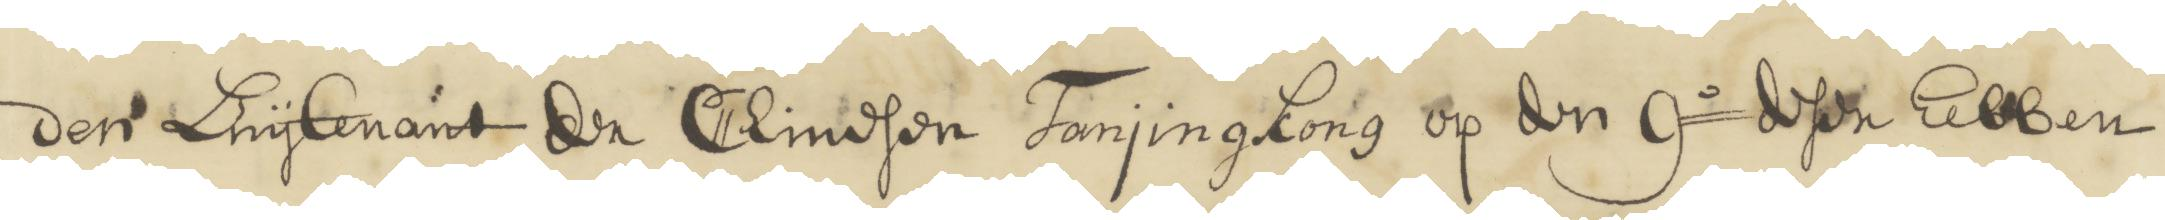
den Luijtenant der Chinesen Tanjingkong op den 9=e deser hebben
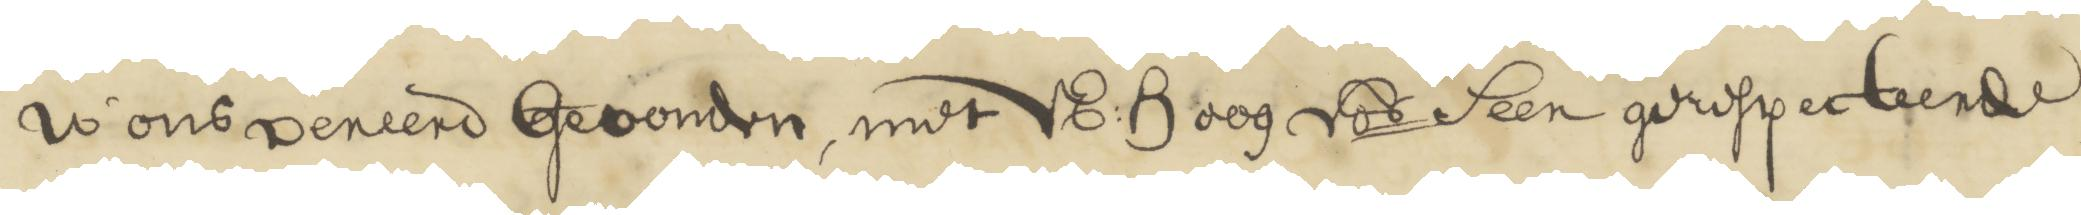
w' ons vereerd Gevonden, met VE: Hoog Ed=s seer gerespecteerde
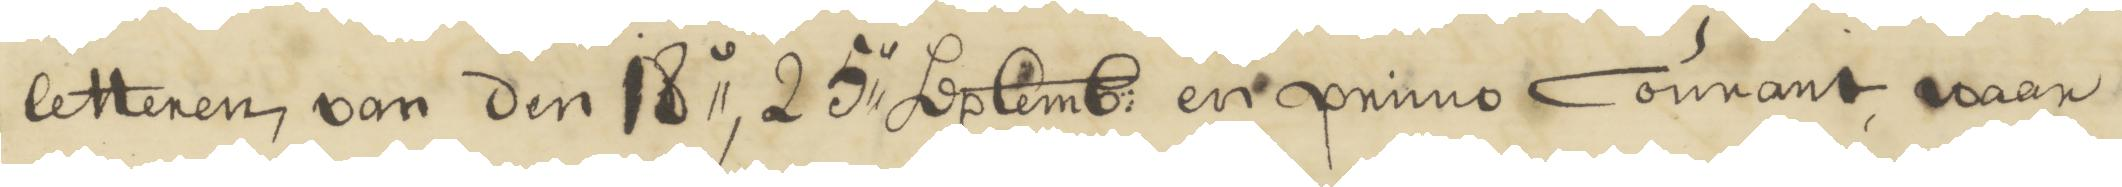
letteren, van den 18„e, 25„e septemb: en primo courant, waar
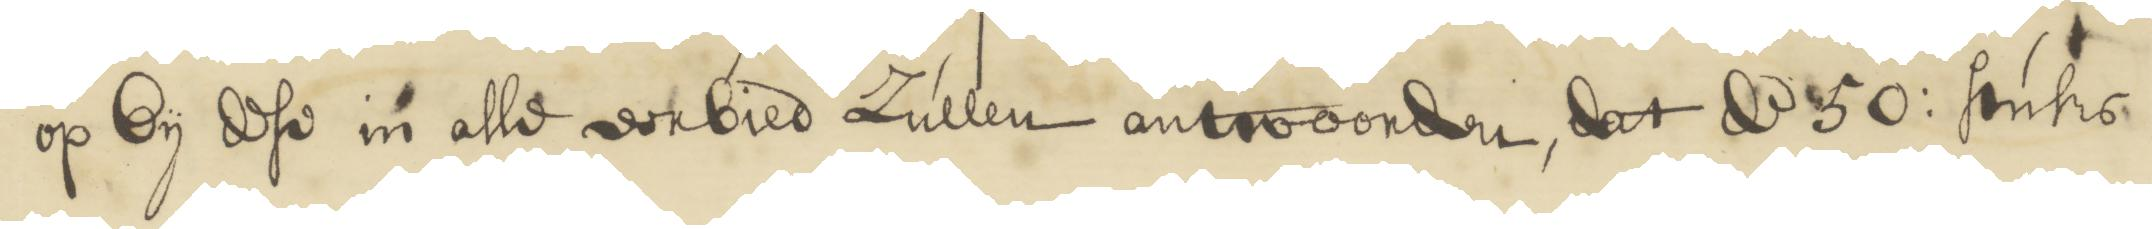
op bij dese in alle eerbied zullen antwoorden, dat de 50: stuks
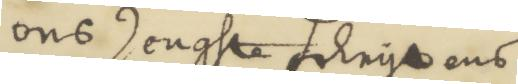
ons jongste schrijvens
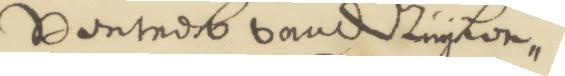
vertrek van de zuijker„
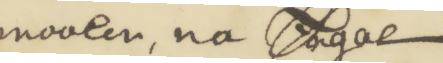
moolen, na Pagal
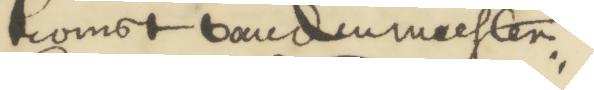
komst van den meester„
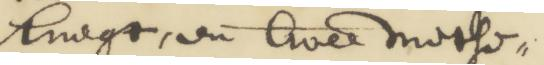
knegt, en twee metse„
